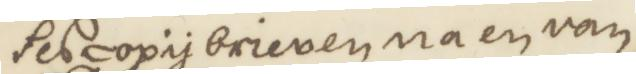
ses copij brieven na en van
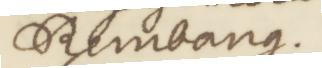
Rembang.
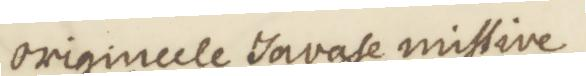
origineele Javase missive
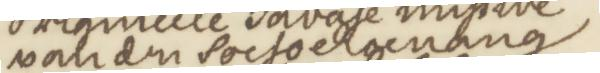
van den soesoehoenang
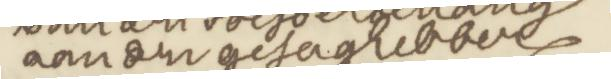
aan den gesaghebber
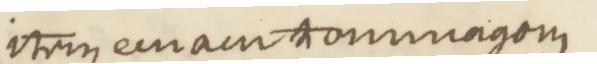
item een aen tommagom
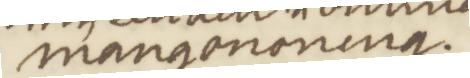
mangononeng.
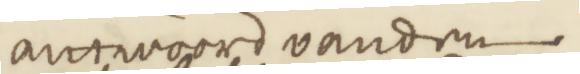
antwoord vanden
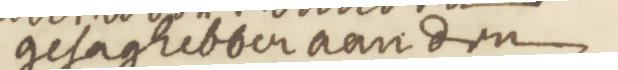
gesaghebber aan den
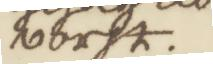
vorst.
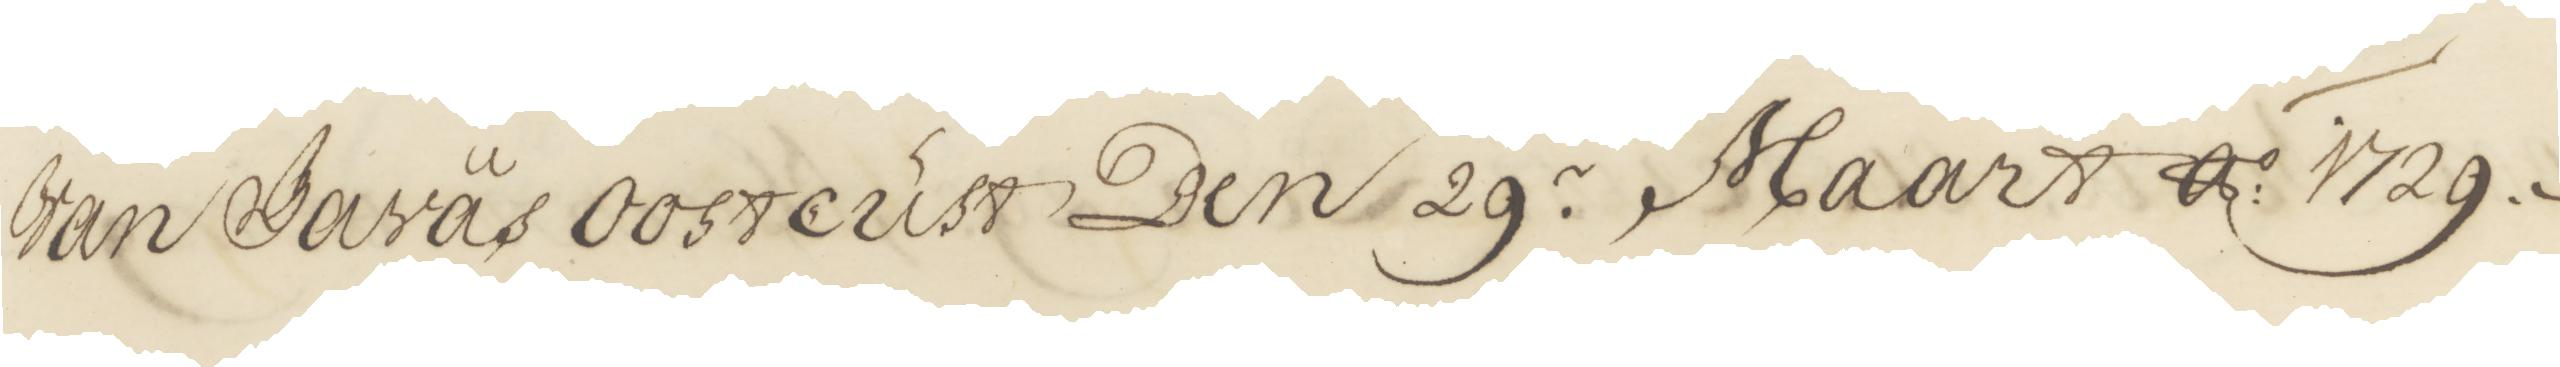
Van Javâs Oost cust Den 29.' Maart A:o 1729.
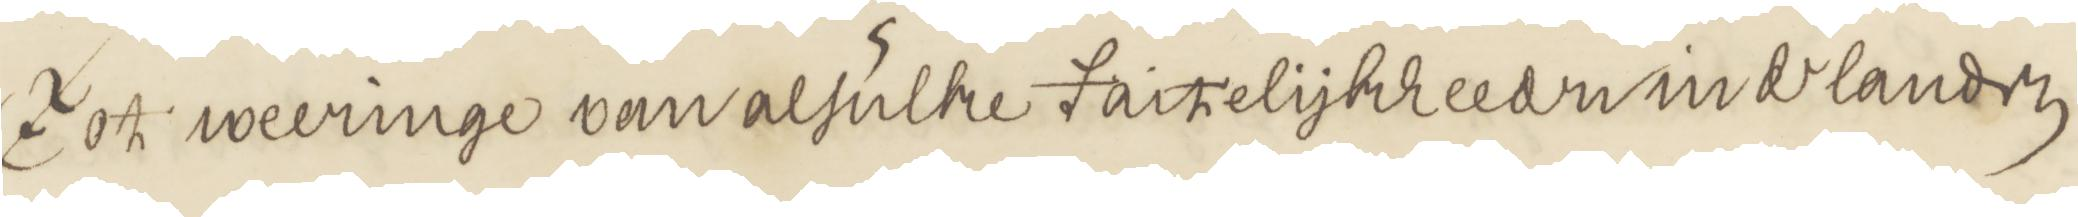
Tot weeringe van alsulke faitelijkheeden in de landen
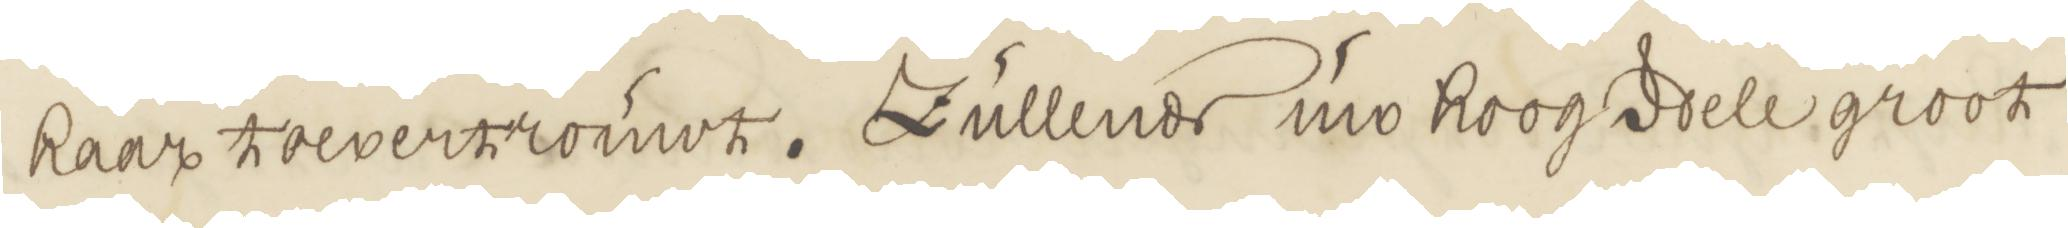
haar toevertrouwt. Zullende uw hoog Edele groot
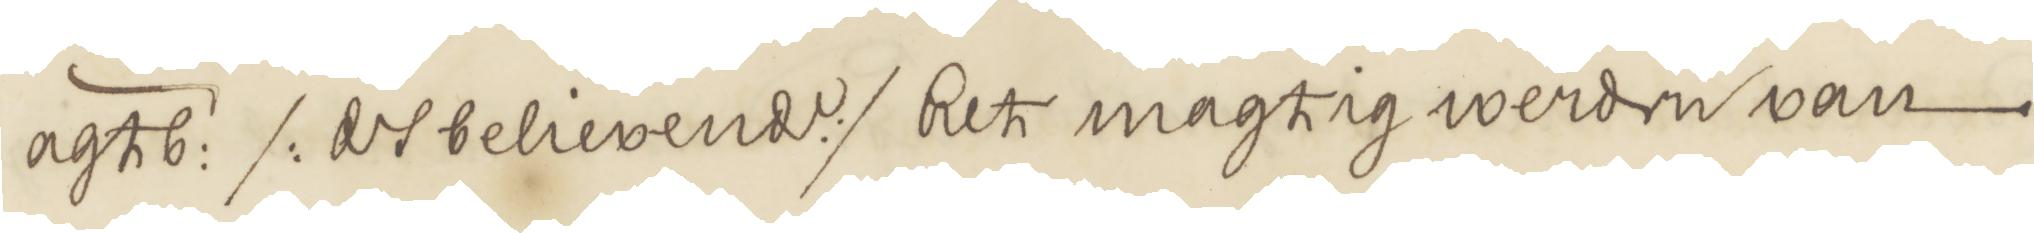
agtb: /:des believende:/ het magtig werden van
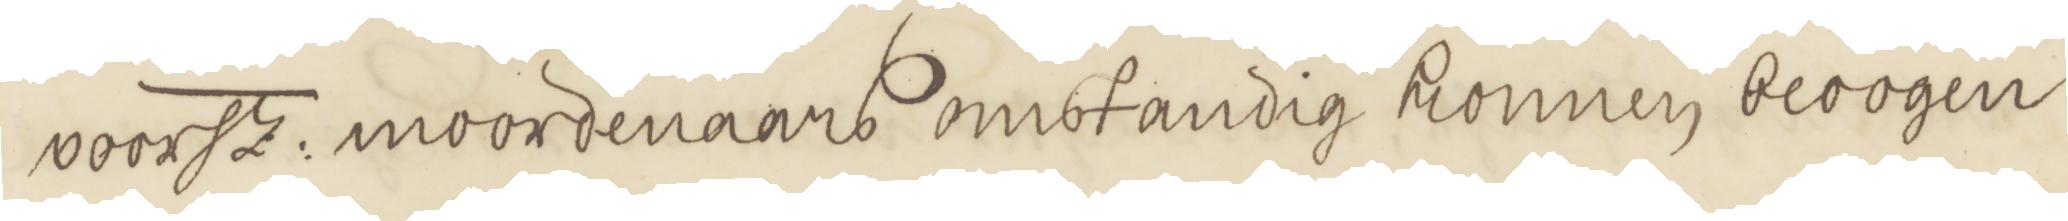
voorsz: moordenaars omstandig konnen beoogen
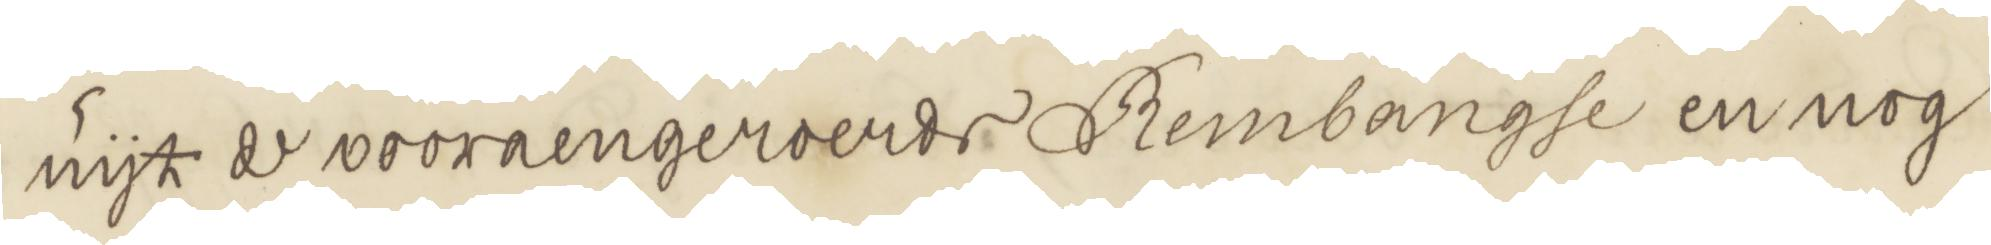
uijt de vooraengeroerde Rembangse en nog
